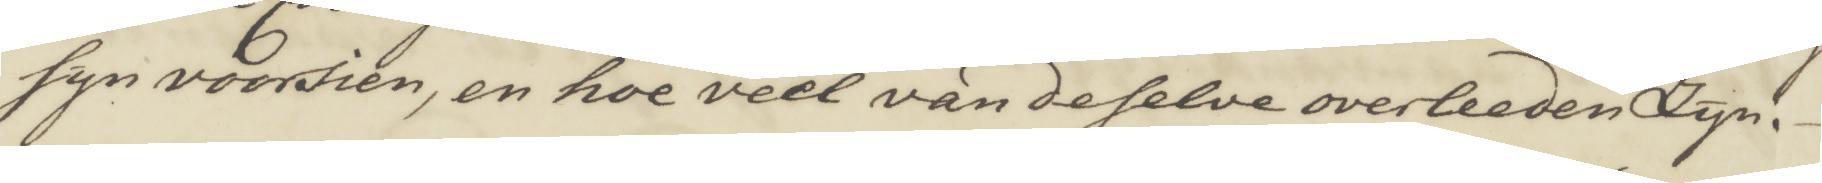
sijn voorsien, en hoe veel van deselve overleeden zijn.-
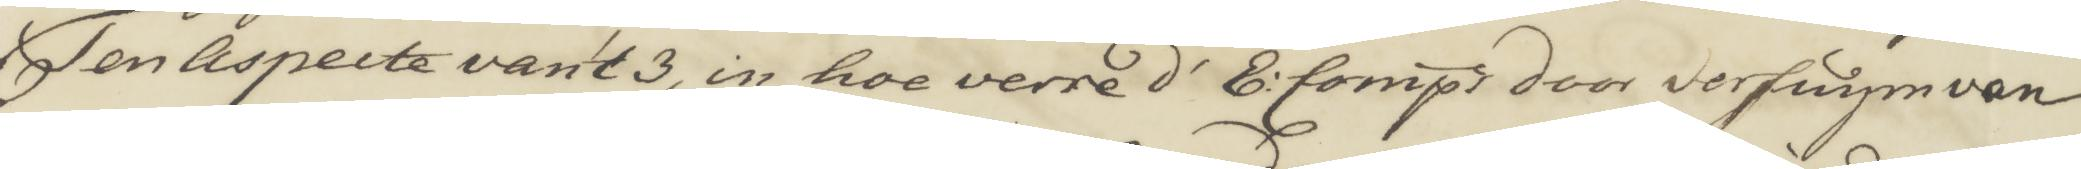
Ten aspecte van ’t 3, in hoe verre d' E: Comp: door versuijm van
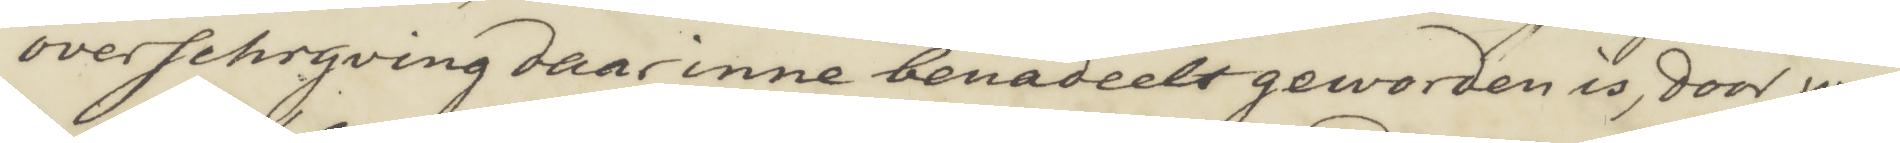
overschrijving daar inne benadeelt geworden is, door wie
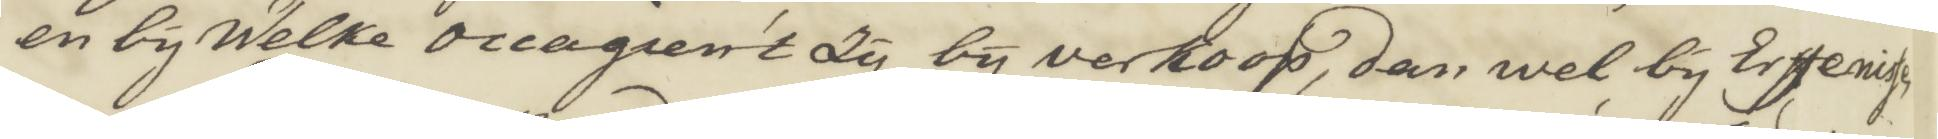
en bij welke occagien 't zij bij verkoop, dan wel bij Erffenissen
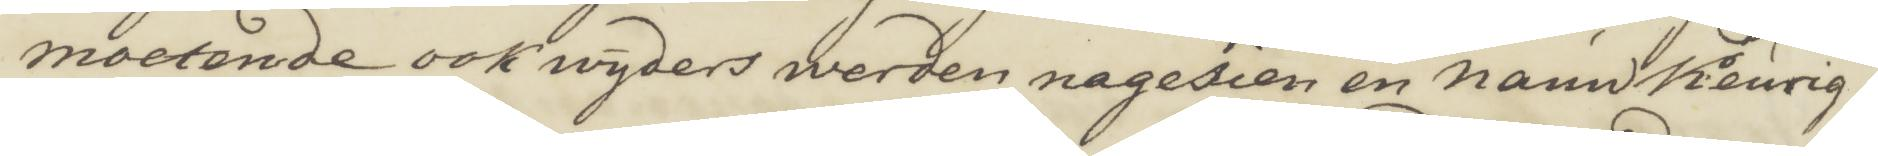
moetende ook wijders werden nagesien en nauwkeurig
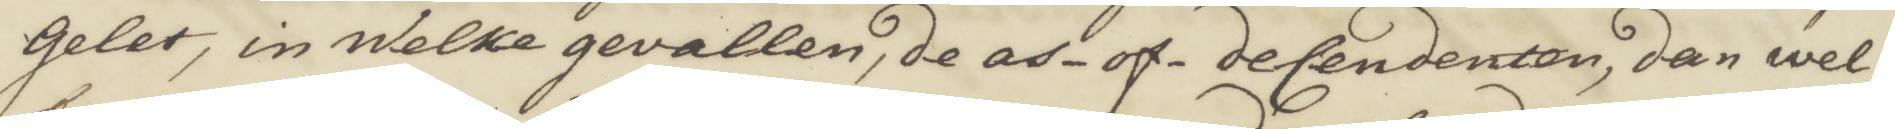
gelet, in welke gevallen, de as-of-decendenten, dan wel
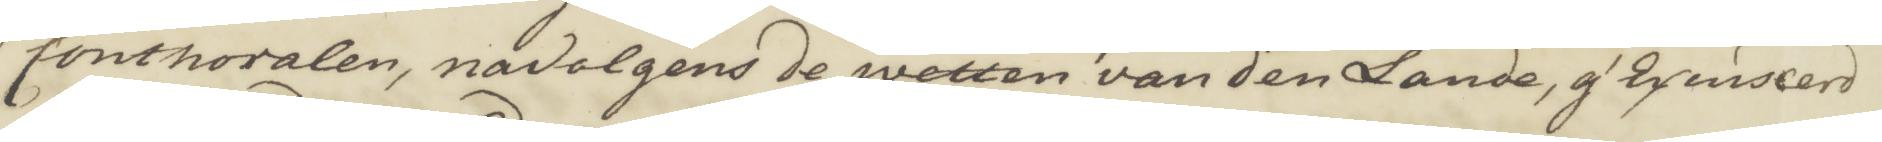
Conthoralen, na volgens de wetten van den Lande, g’ Excuseerd
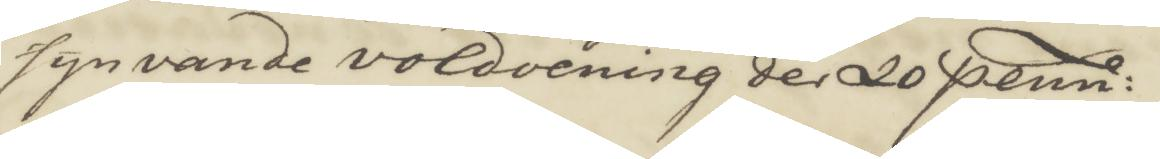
sijn vande voldoening der 20 penn:e
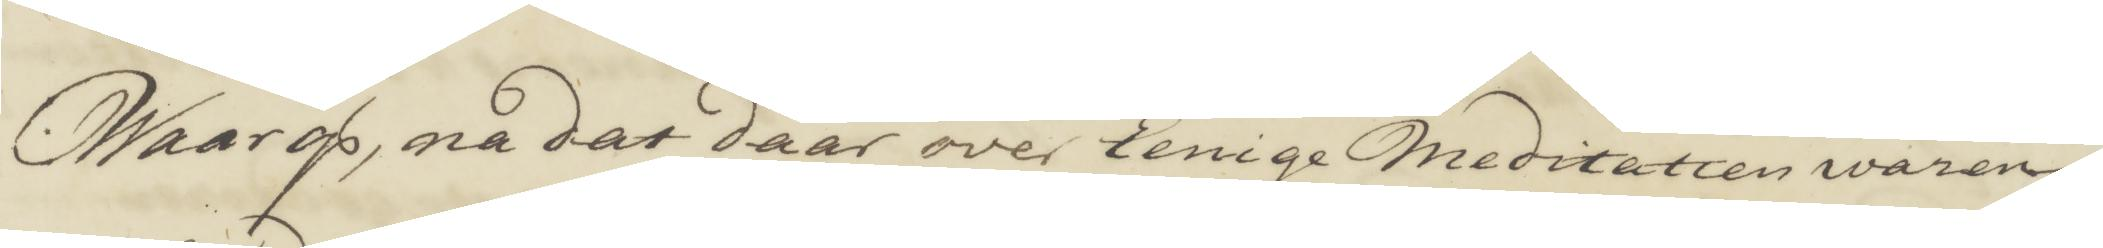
Waar op, na dat daar over Eenige meditatien waren
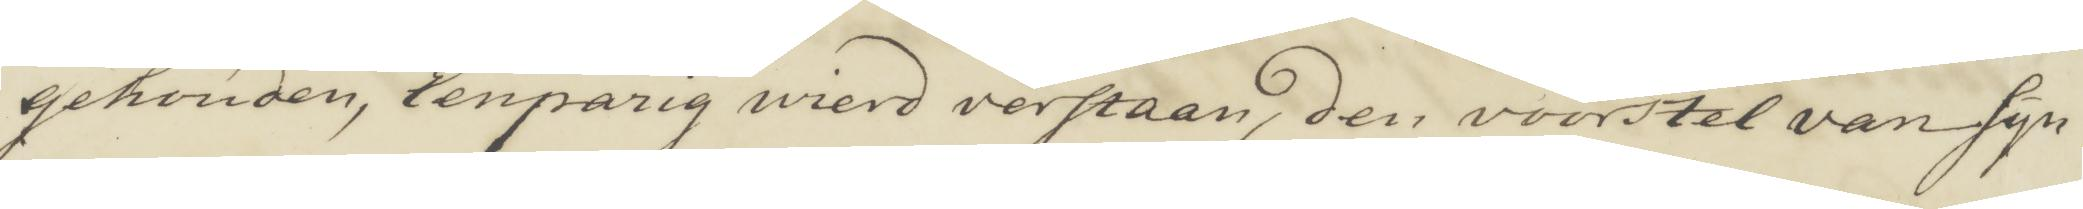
gehouden, Eenparig wierd verstaan, den voorstel van sijn
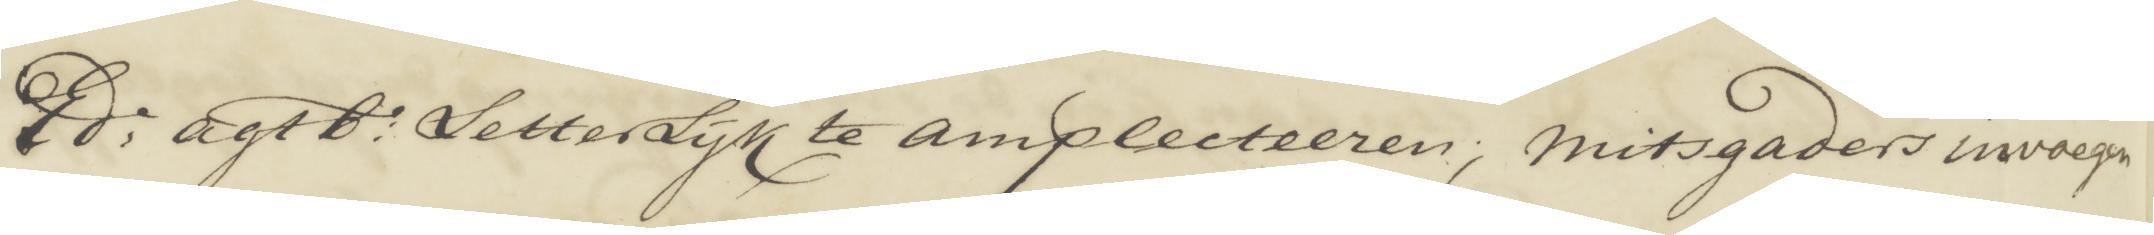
Ed:e agtb: Letterlijk te amplecteeren; mitsgaders invoegen
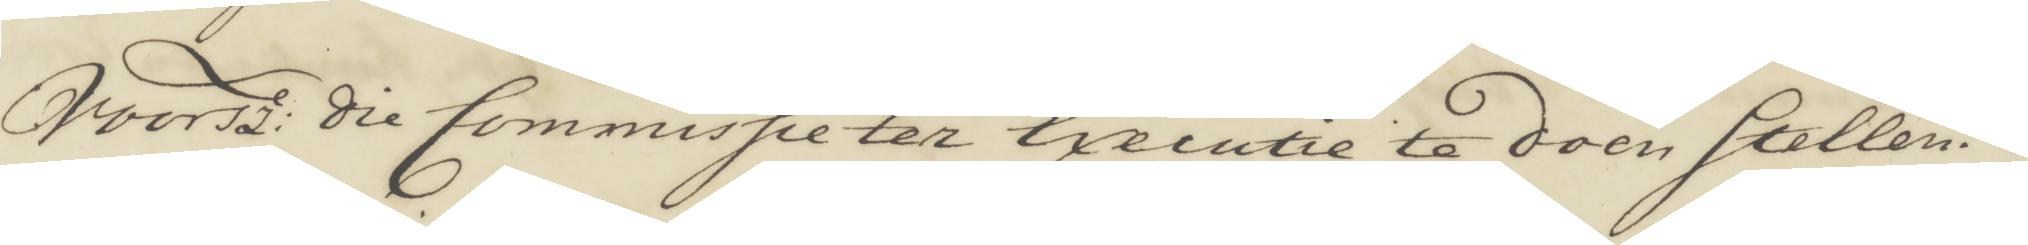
voorsz:e die Commissie ter Executie te doen stellen.
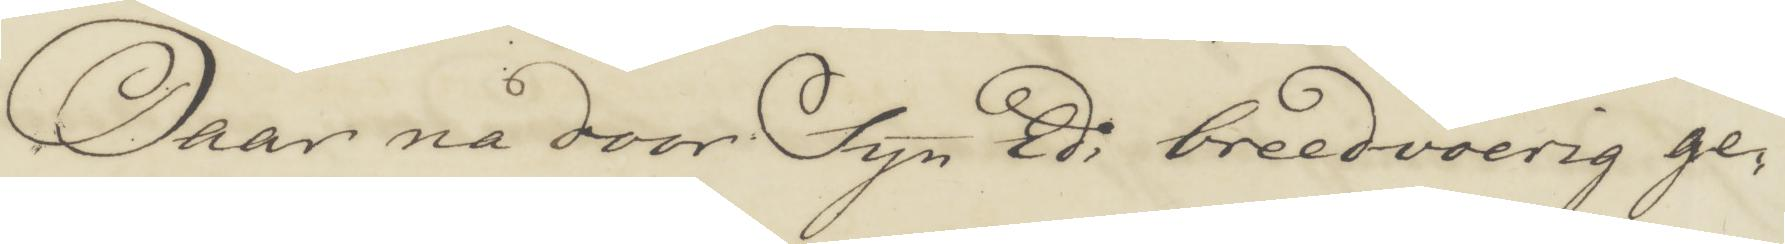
Daar na door sijn Ed:e breedvoerig ge:
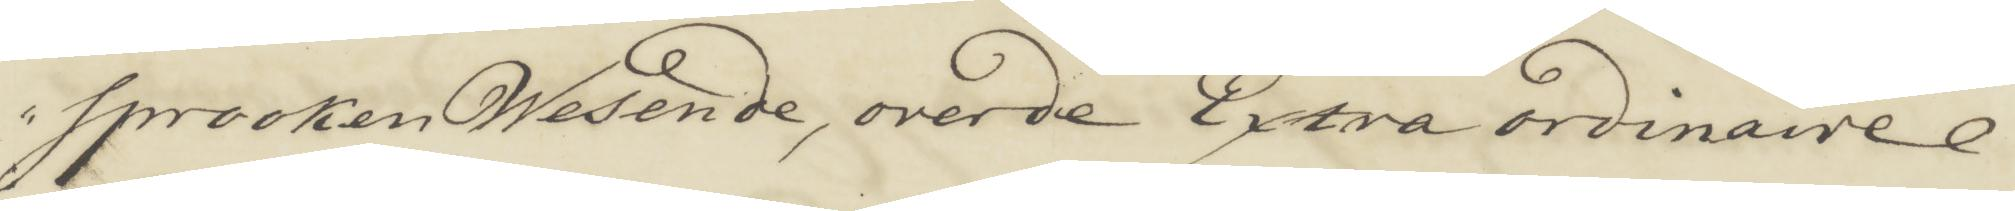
„sprooken Wesende, over de Extra ordinaire
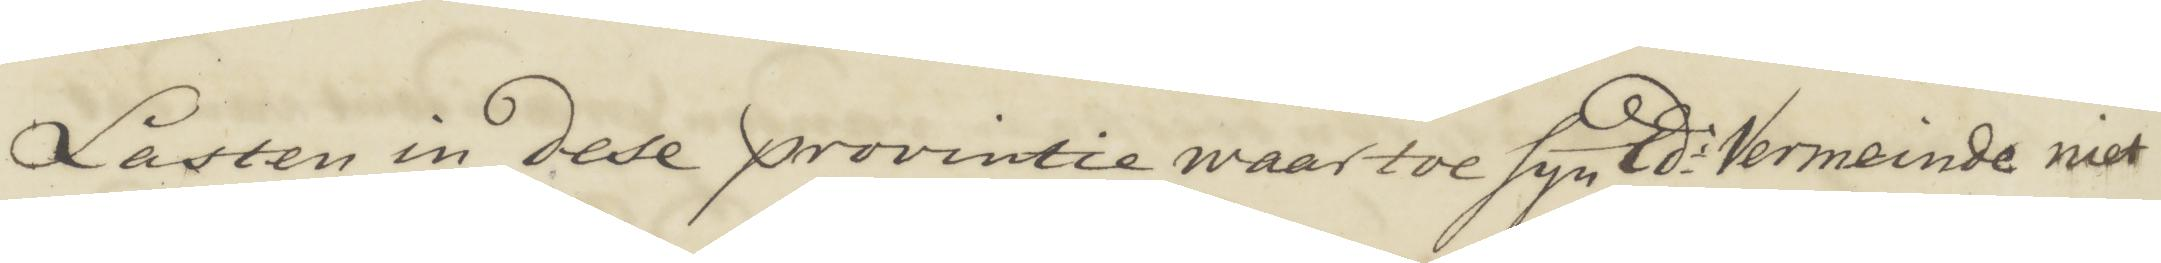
Lasten in dese provintie waar toe sijn Ed:' vermeinde niet
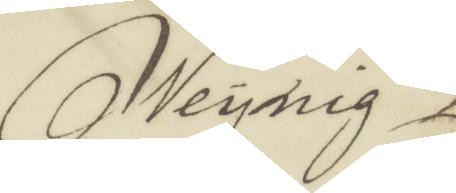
Weijnig
